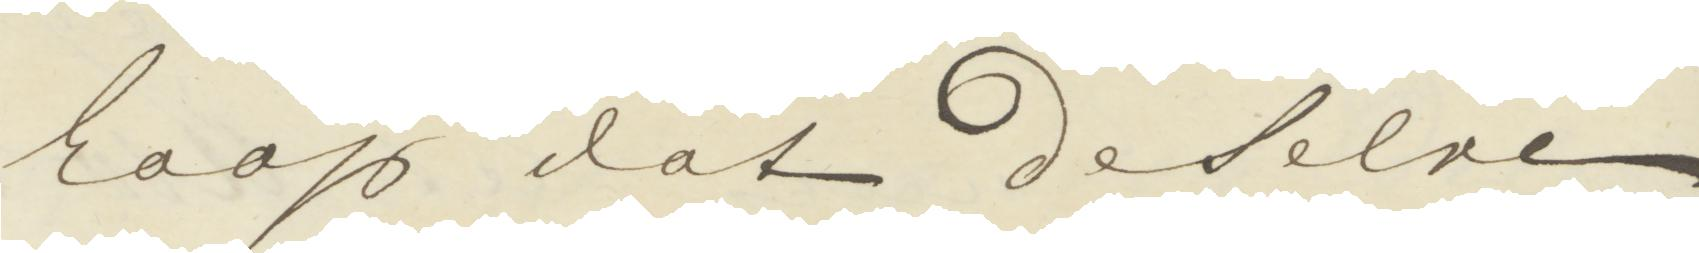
hoop dat deselve
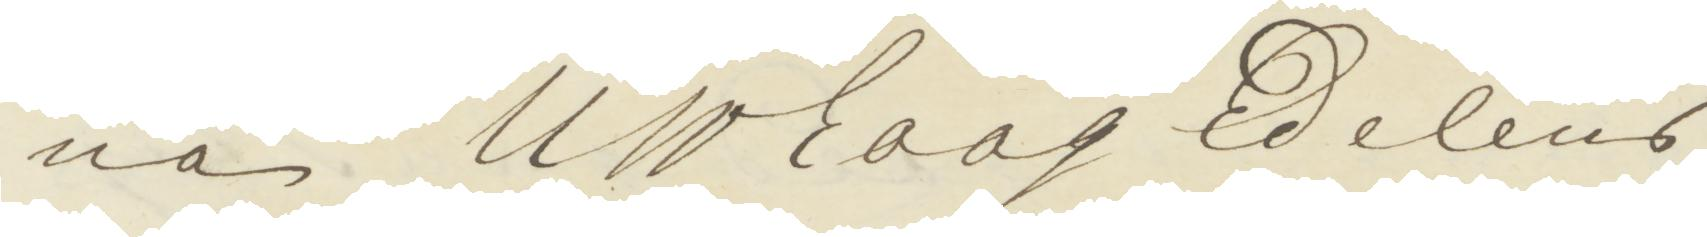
na UW hoog Edelens
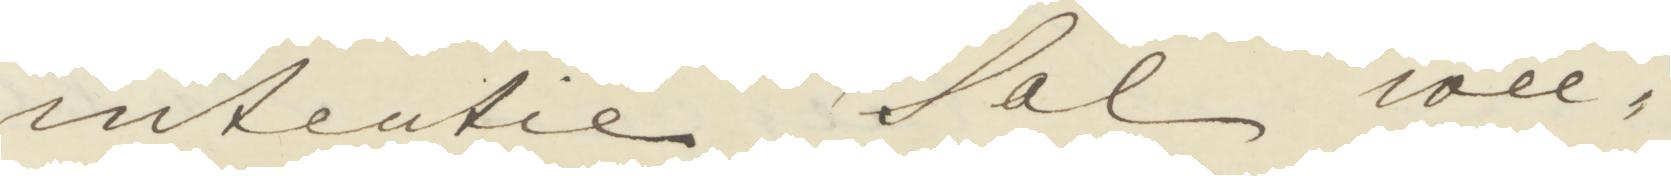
intentie sal wee„
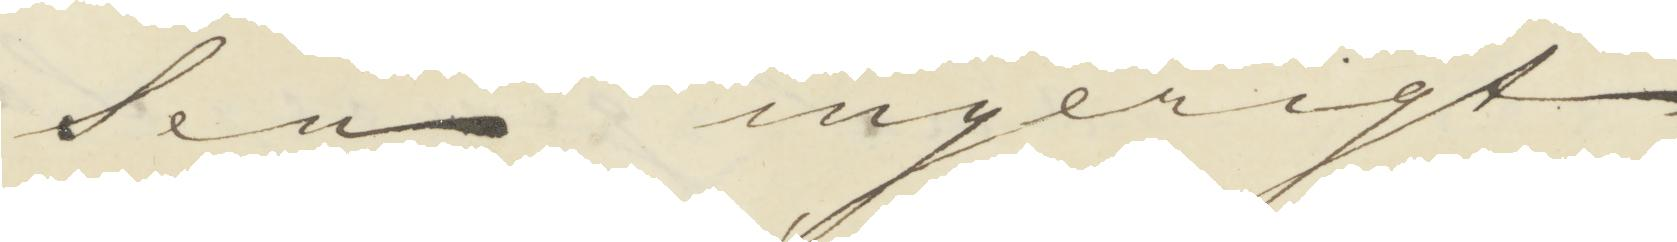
sen ingerigt
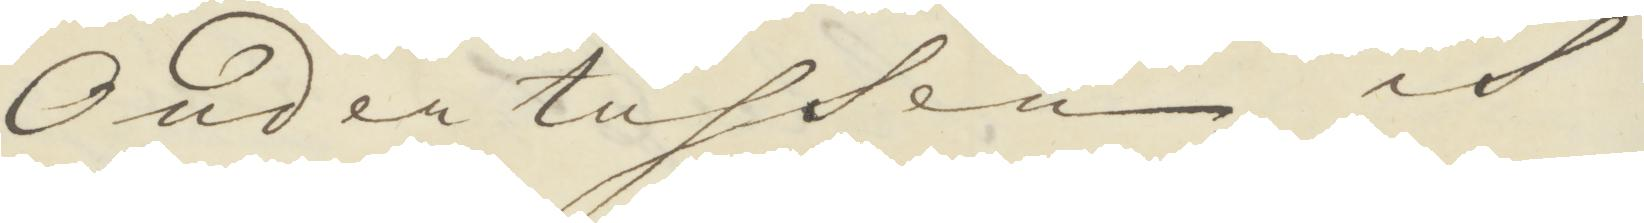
Onder tussen is
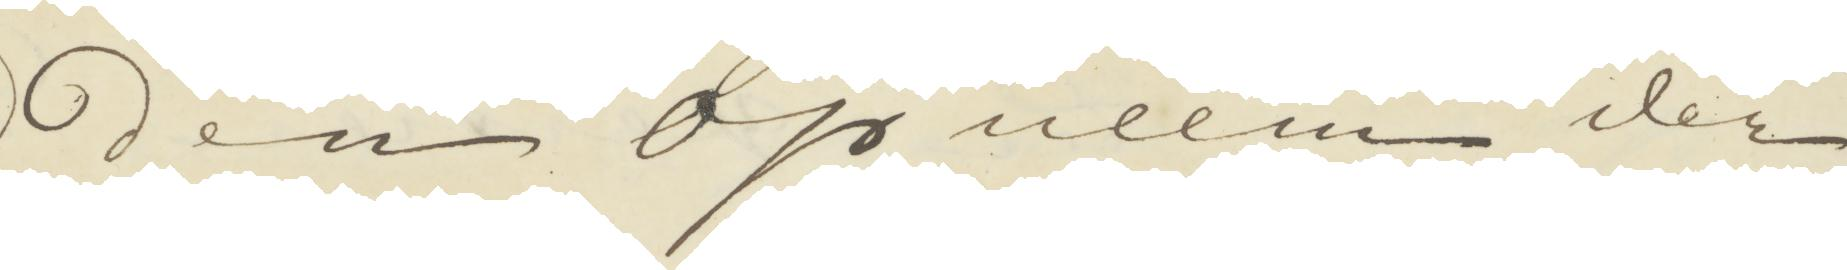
den op neem der
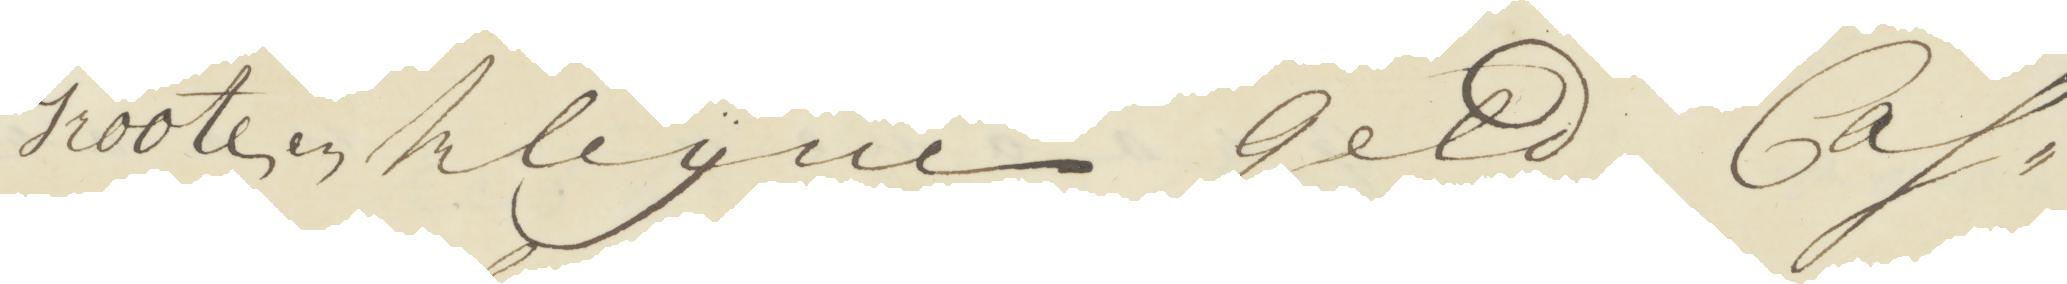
Grooten kleijne geld Cas„
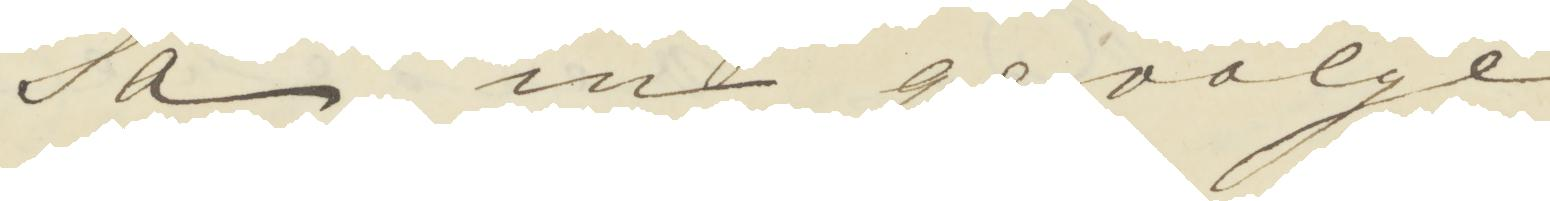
sa in gevolge
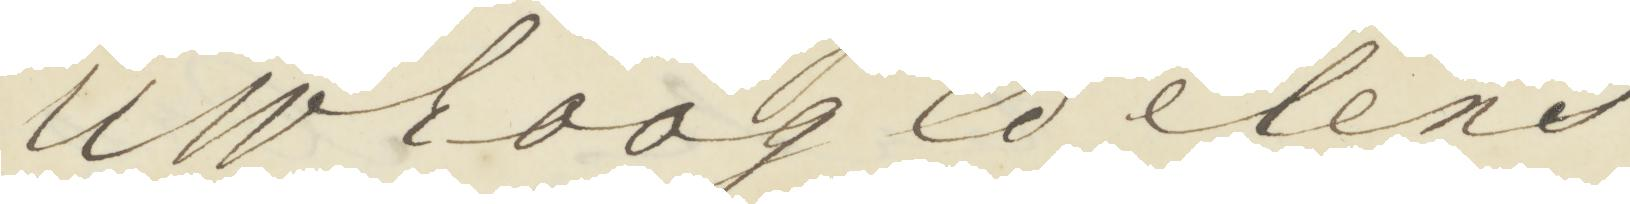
UW hoog Edelens
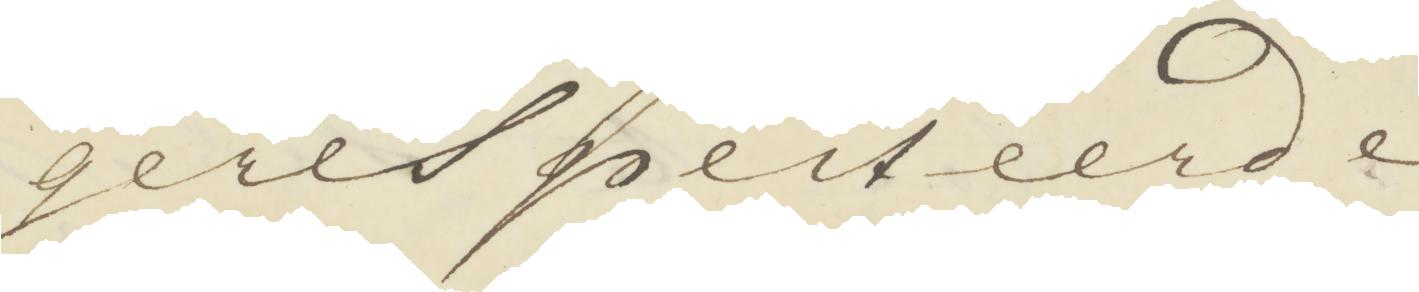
gerespeiteerde
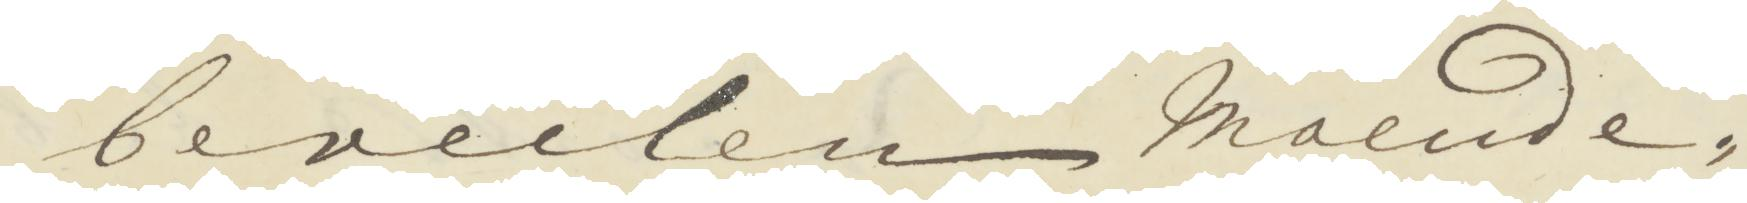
beveelen maende„
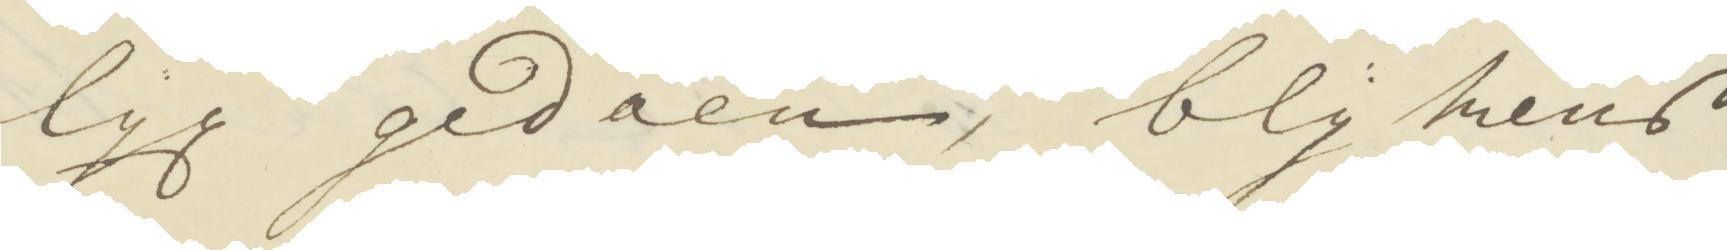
lijx gedaen, blijkens
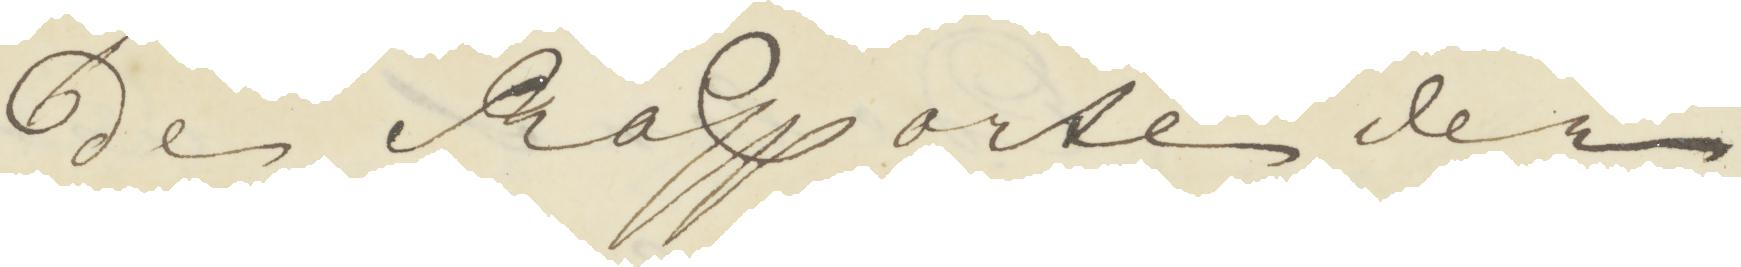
de Rapporte der
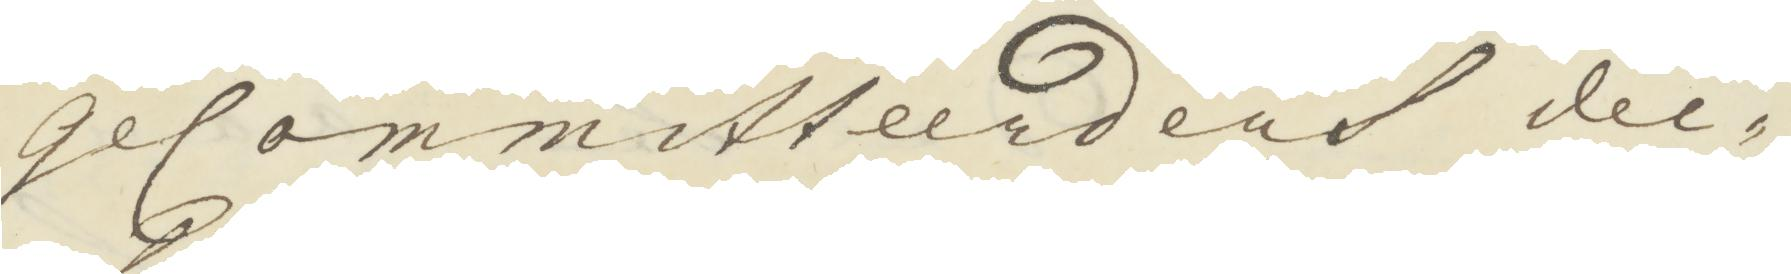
gecommitteerdens dee„
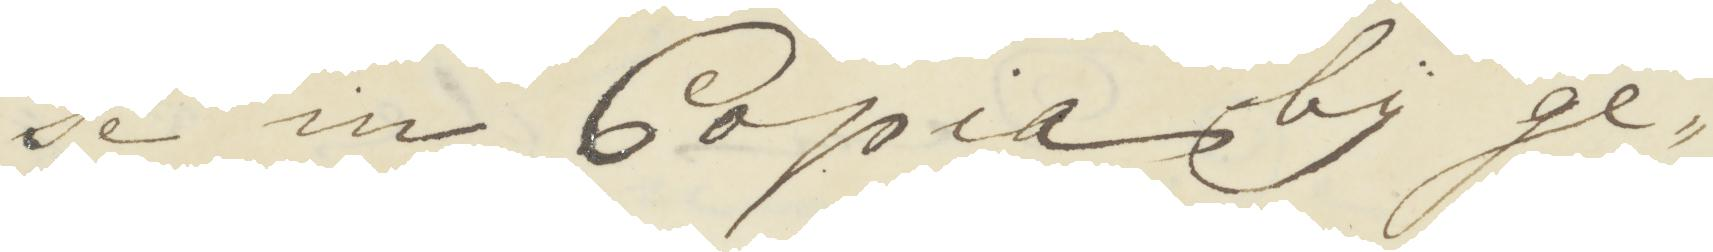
se in Copia bij ge„
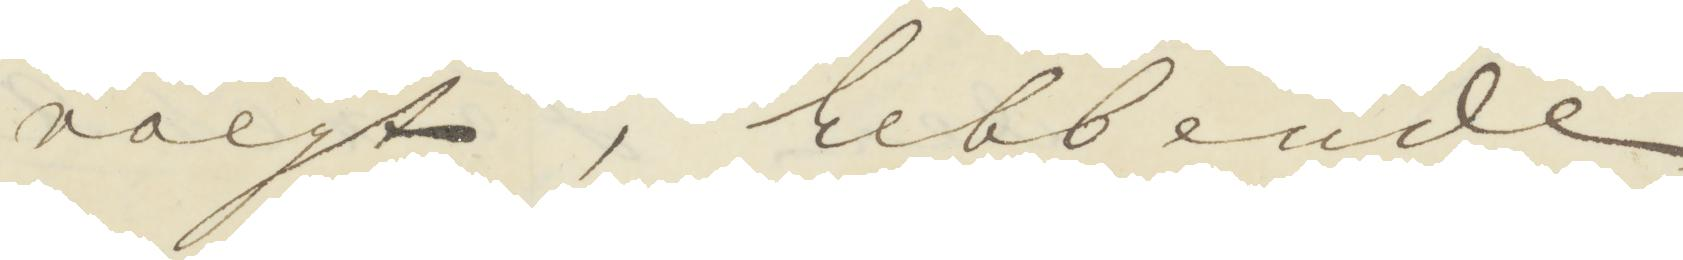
voegt, hebbende
